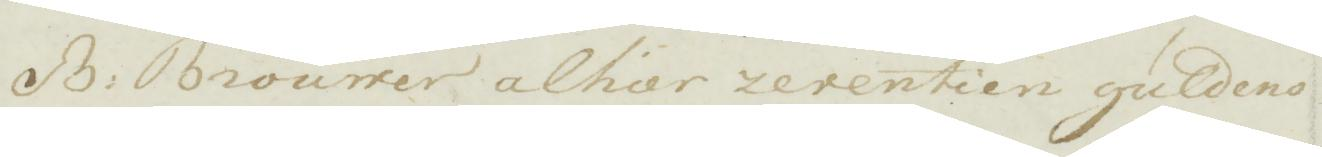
B: Brouwer alhier zeventien guldens
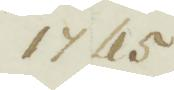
17 45
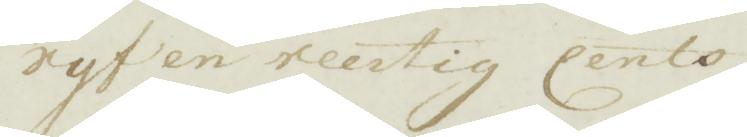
vyf en veertig Cents - - - - - - - - - -
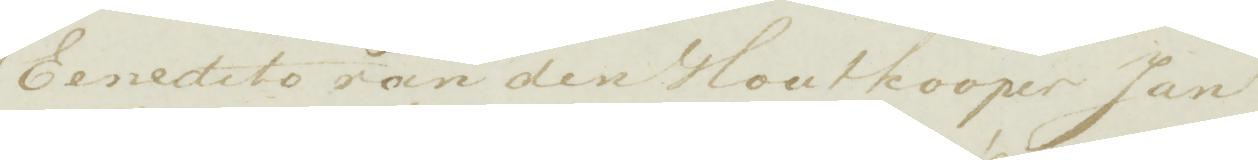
Eene dito van den Houtkooper Jan
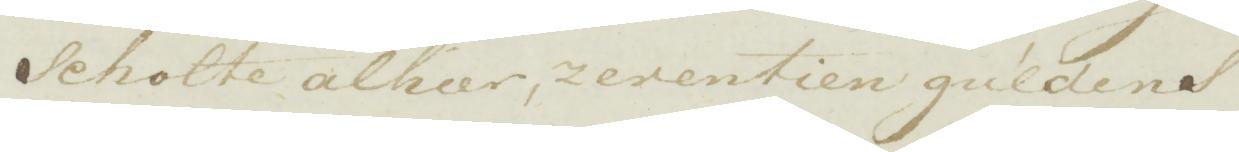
Scholte alhier, zeventien guldens
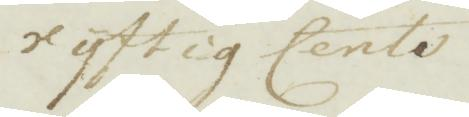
vijftig Cents - - - - - - - - - - - - - -
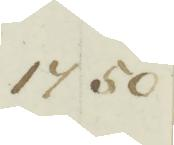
17 50
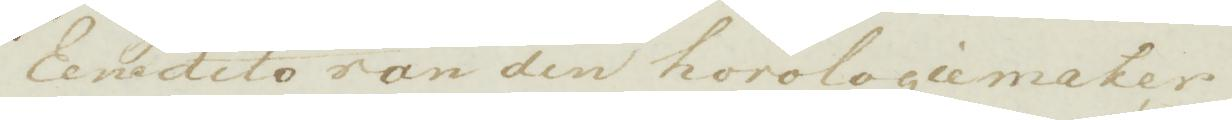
Eene dito van den horologiemaker
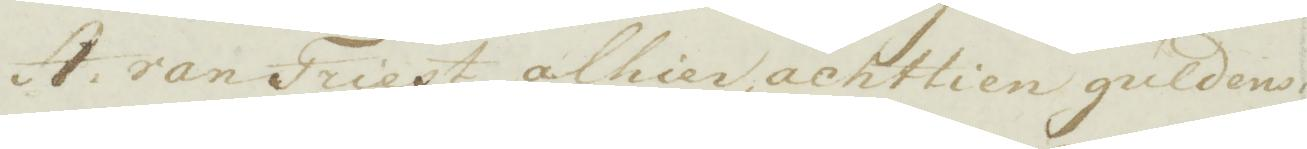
A: van Friest, alhier, achttien guldens
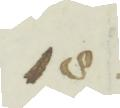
18 . —
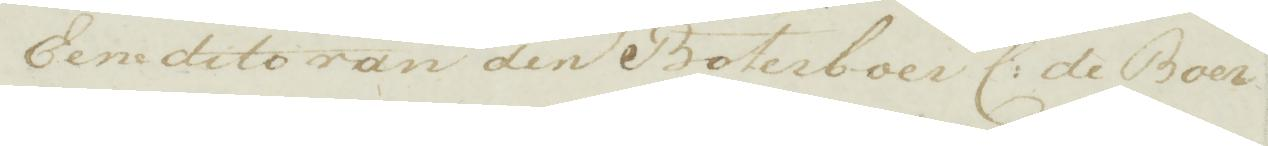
Eene dito van den Boterboer C: de Boer
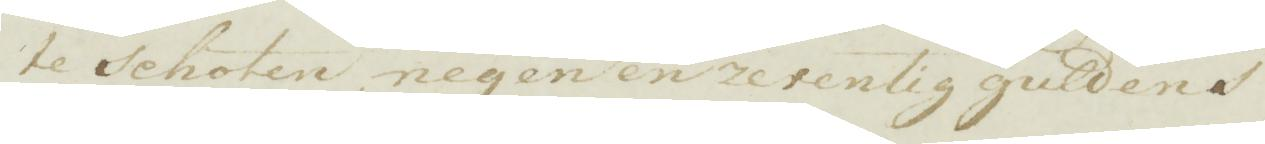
te schoten, negen en zeventig guldens
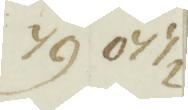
79 07½
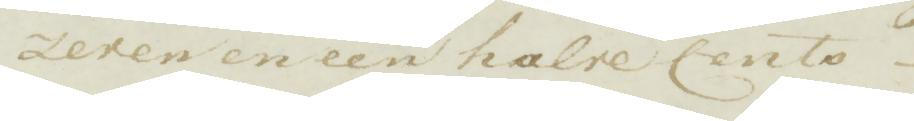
zeven en een halve Cents - - - - - - -
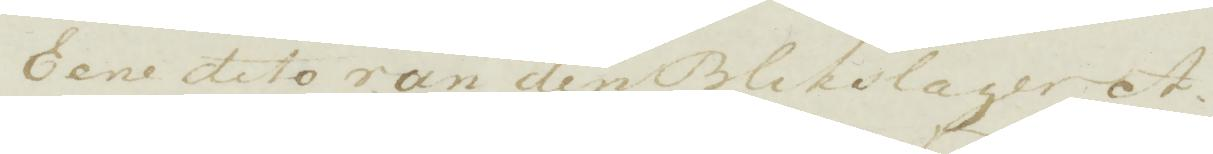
Eene dito van den Blikslager A.
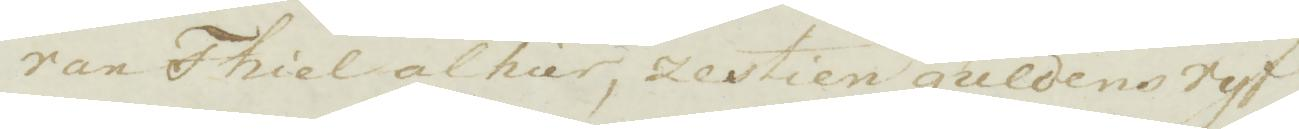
van Thiel alhier, zestien guldens vyf
